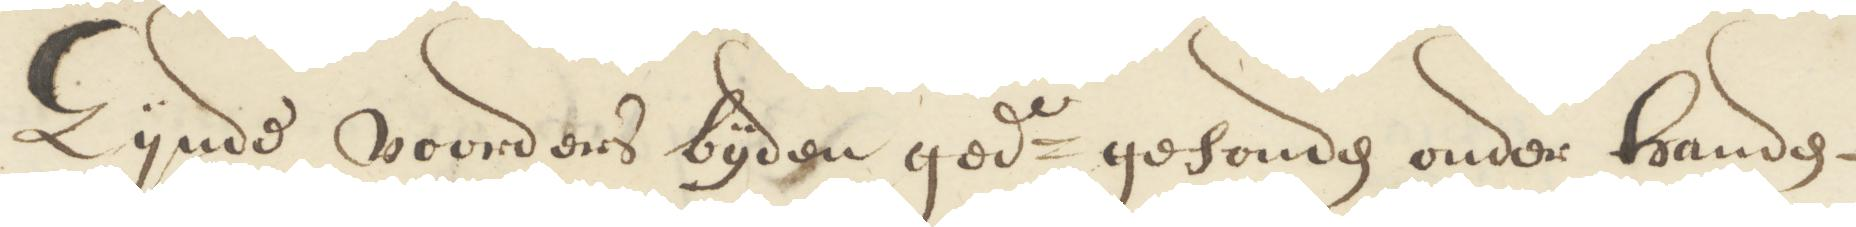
zijnde voordens bijden ged=e gesonden onder handen
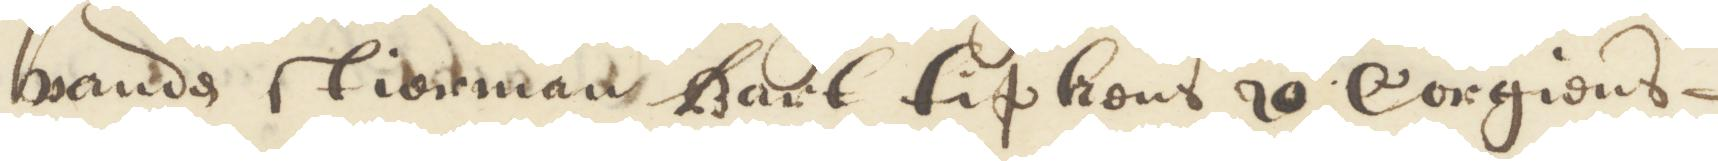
vanden stierman Bart tipkens 20 Corgiens —
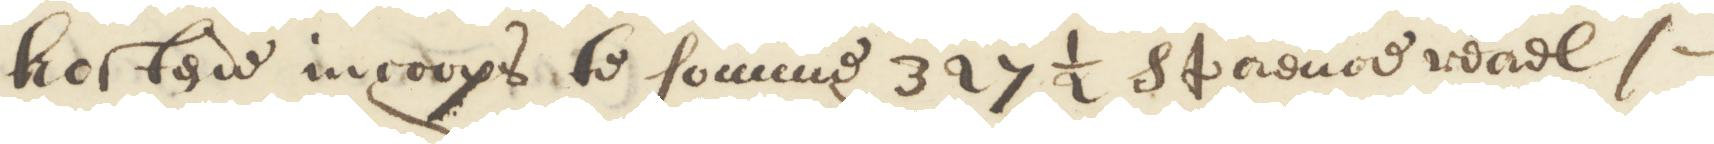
kostende incoops te somme 327½ spaence reael / —
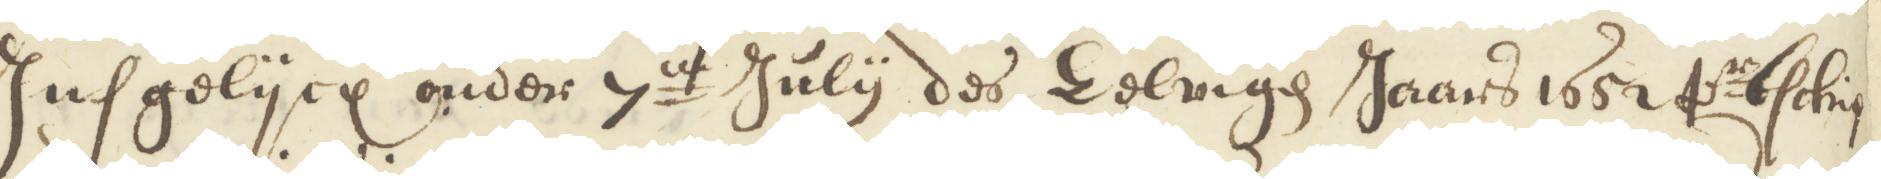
Insgelijcx onder 7=en Julij des zelvigen Jaars 1652 p=r schip
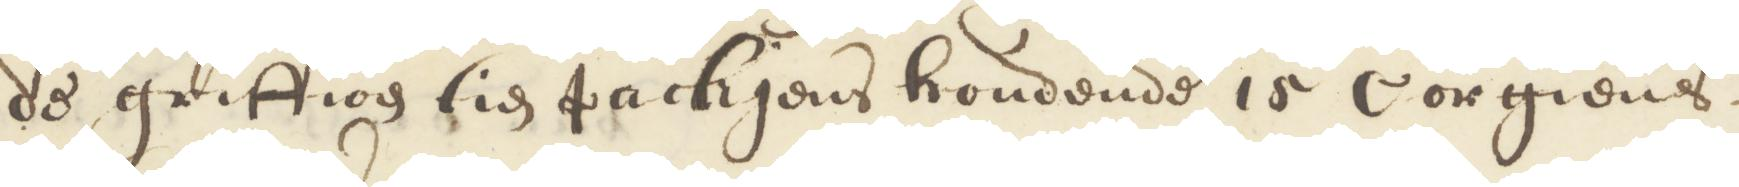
de griffioen tien packjens houdende 15 Corgiens
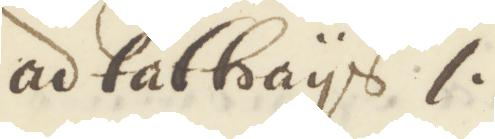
ad tathaijs /.
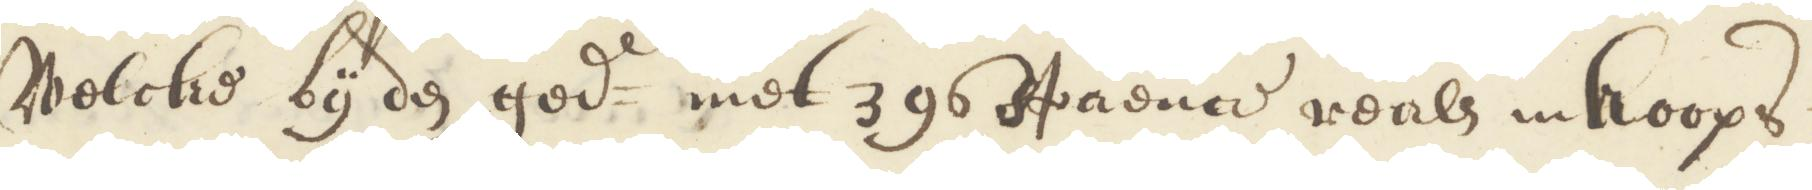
Welcke bij den ged=e met 396 spaence realen inkoops
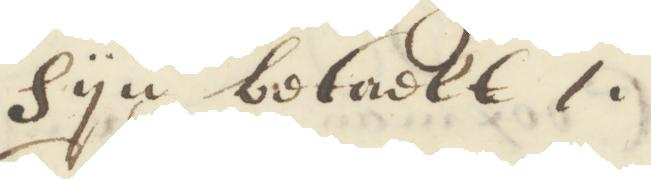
sijn betaelt /.
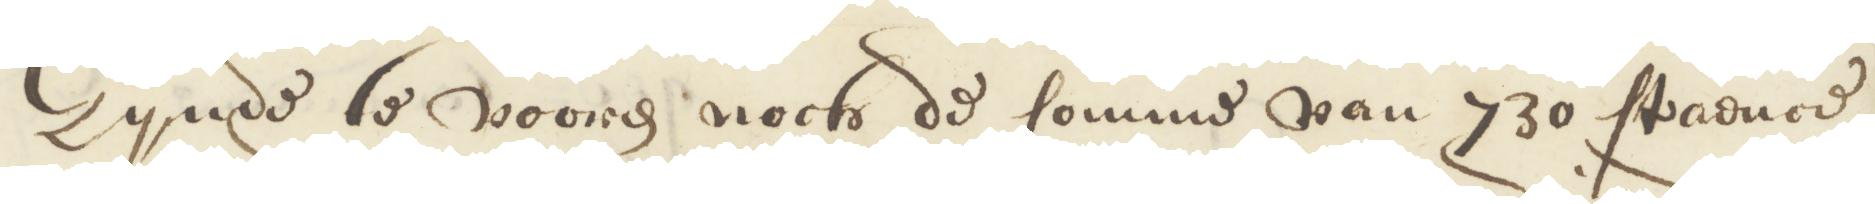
Zijnde te vooren noch de somme van 730 spaence
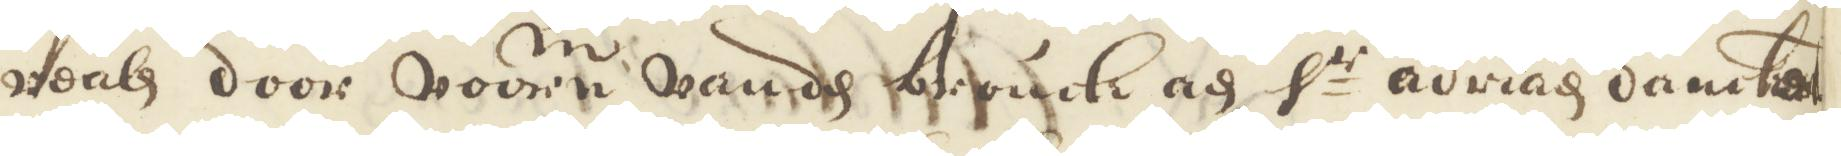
realen door voorn vanden brouck aen s=r adriaen danckert
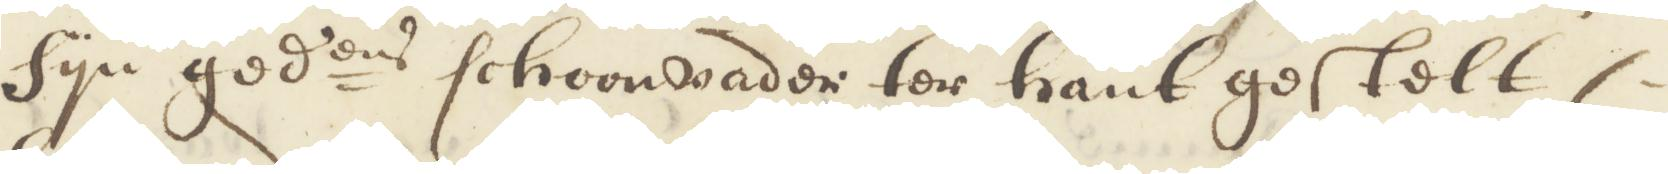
sijn ged=ens schoonvader ter hant gestelt /.
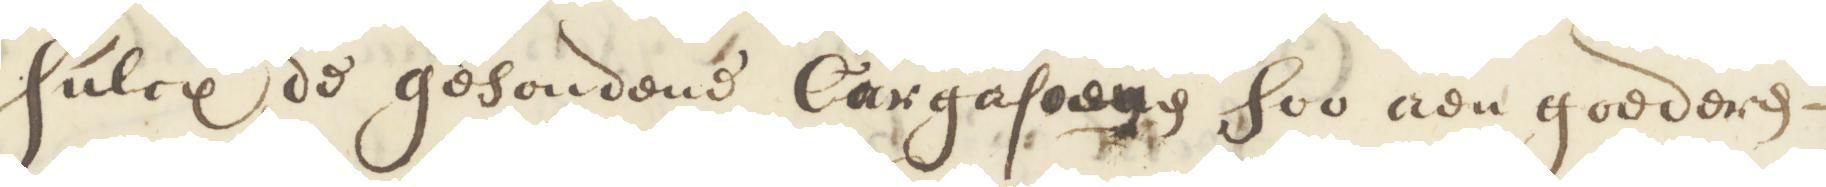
Sulcx de gesondene Cargasoenen soo aen goederen
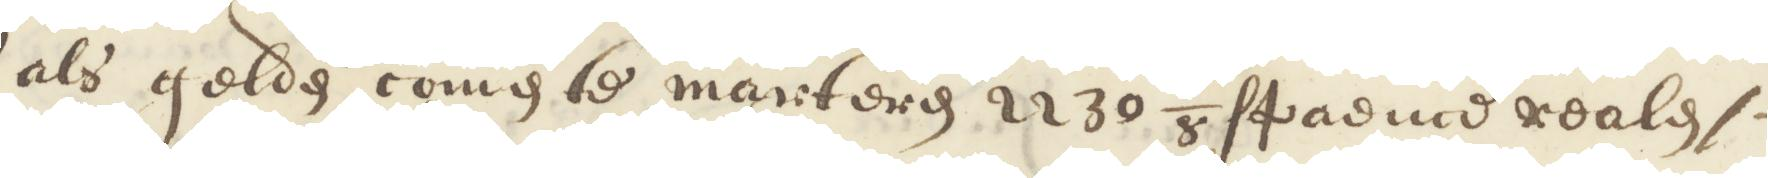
als gelden comen te marteren 2230 7/8 spaence realen /
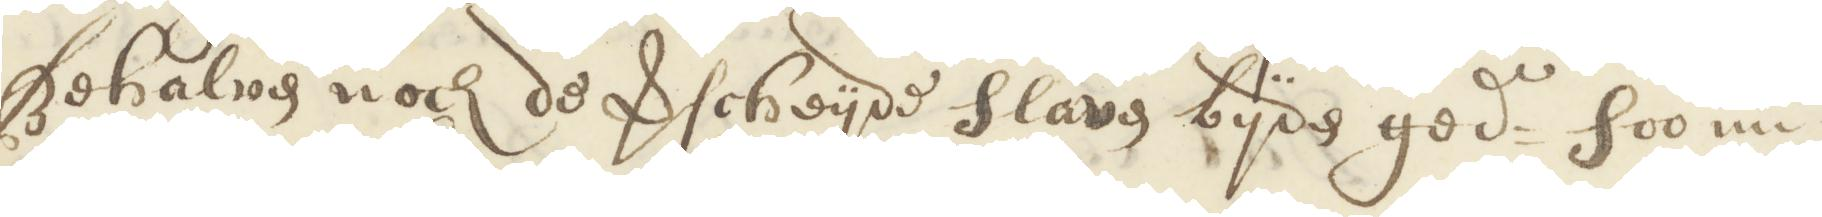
Behalven noch de verscheijde slaven bijden ged=e soo nu
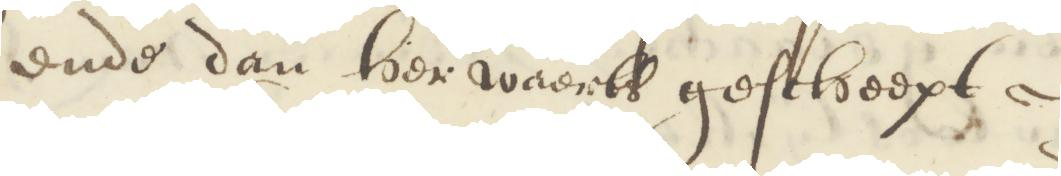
ende dan her waerts gescheept
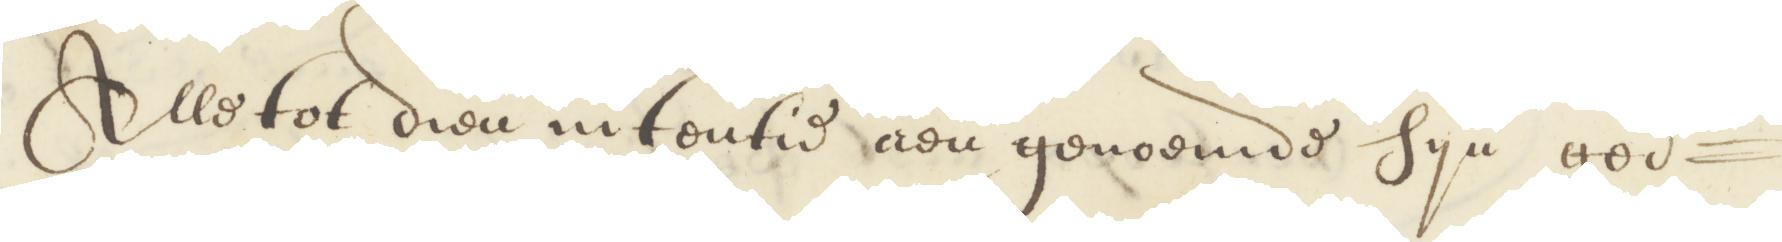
Alle tot dien intentie aen genoemde sijn ged=ens
